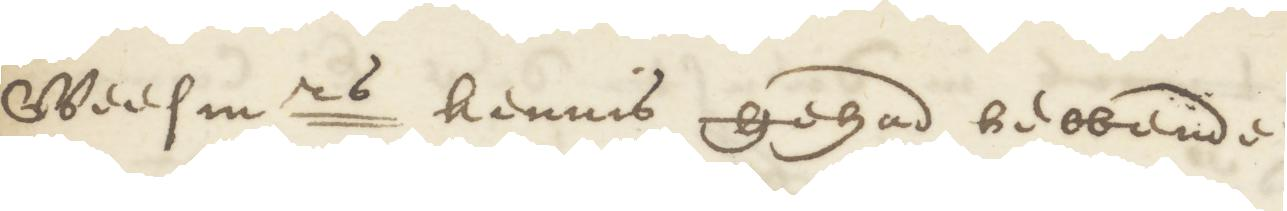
weesm=rs kennis gehad hebbende
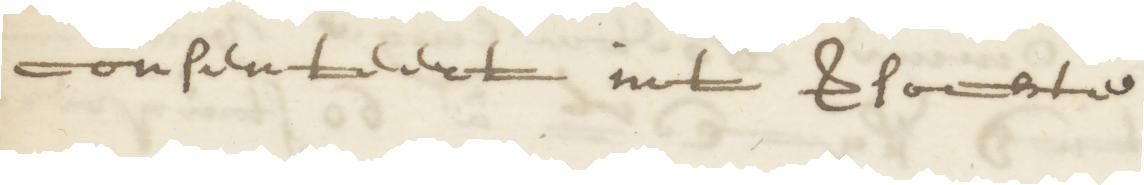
consenteert in t versochte
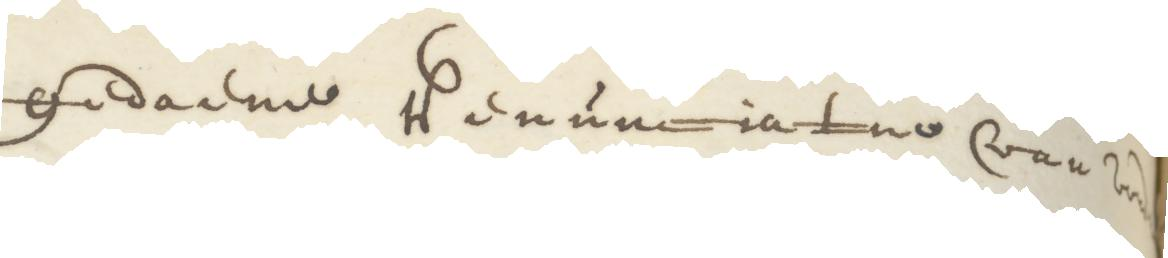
gedaene Renunciatie van
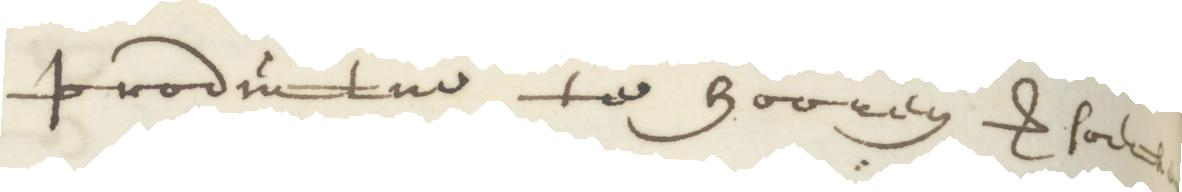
productie te hooren versoeck
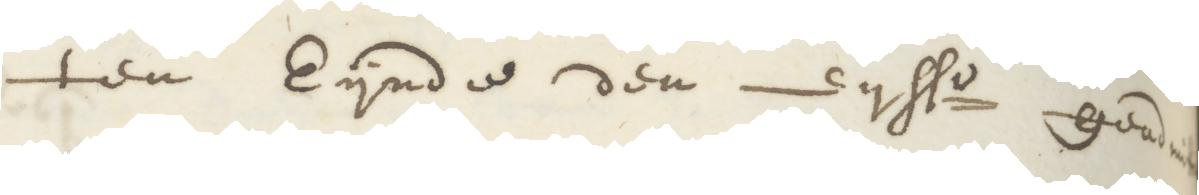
ten Eijnde den Eijss=r gead
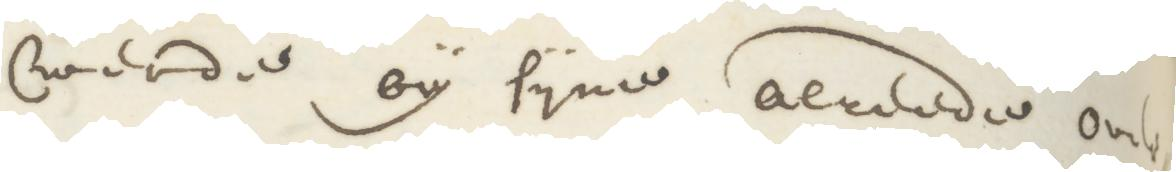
werde bij sijne alreede over
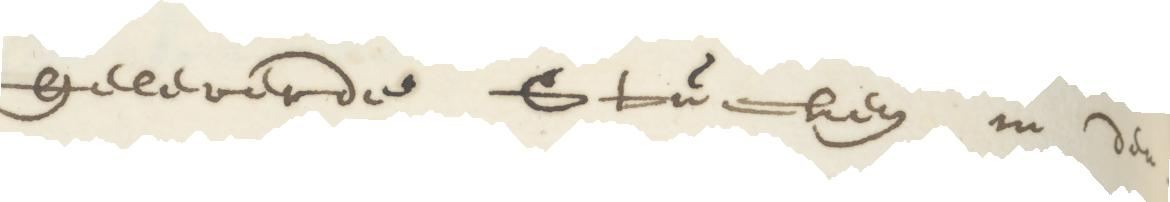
geleverde stucken in den
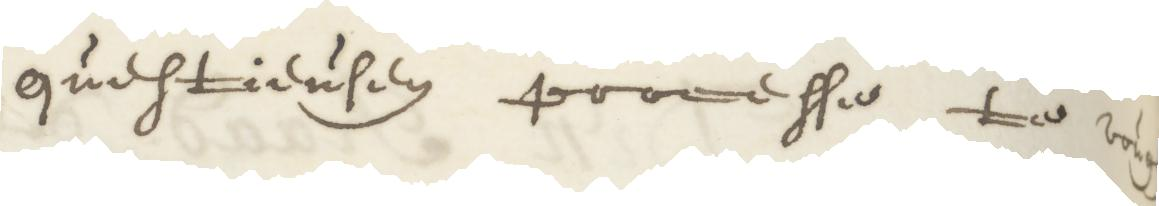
questieusen poocessie te vou
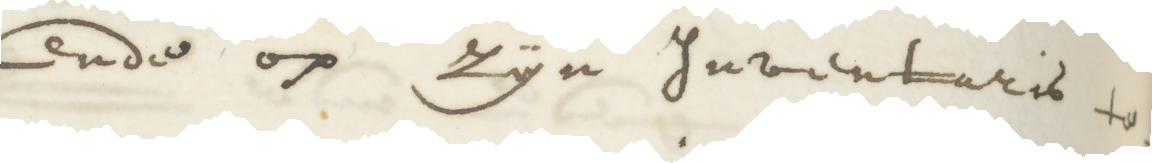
Ende op zijn Jnvertaris te
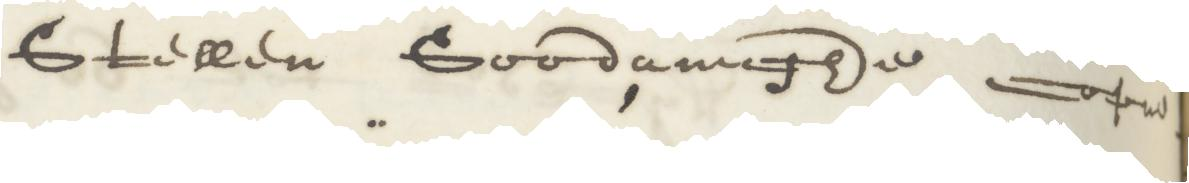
stellen soodanighe copie
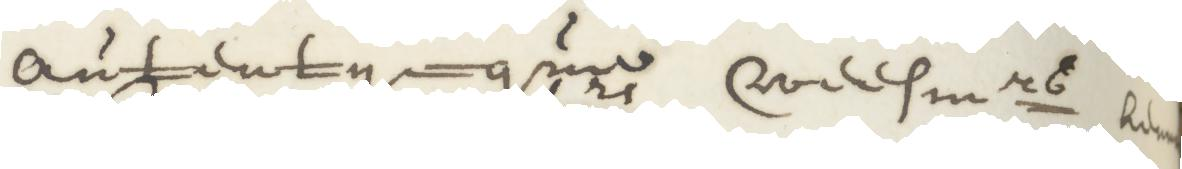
autentijcque weesm=rs he
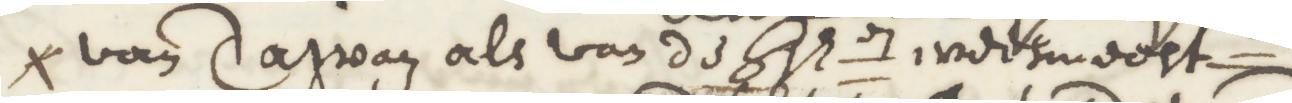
* van Cajvan als van de 8st=en weesmeest=rs
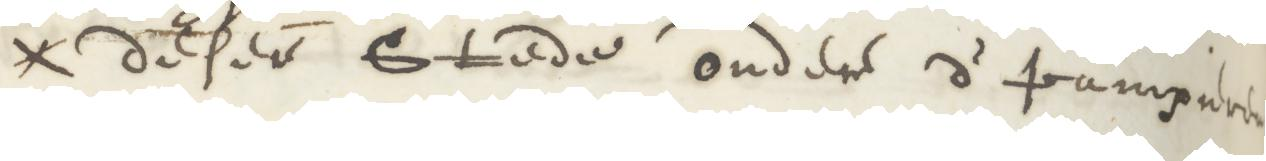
* deser stede onder d’ pampur
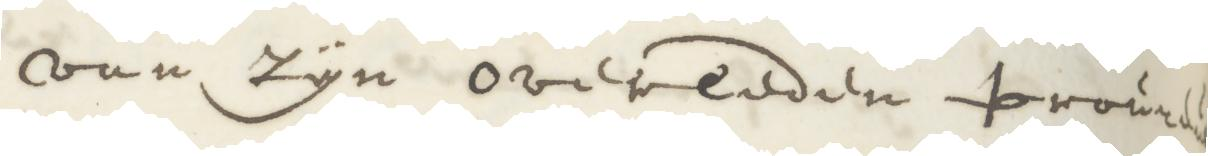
van zijn overleden prourd
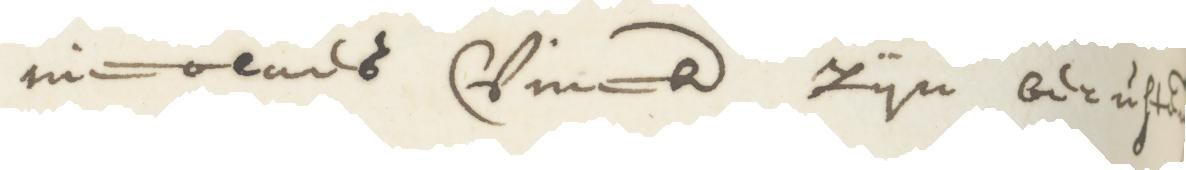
nicolaes Vinck zijn berust
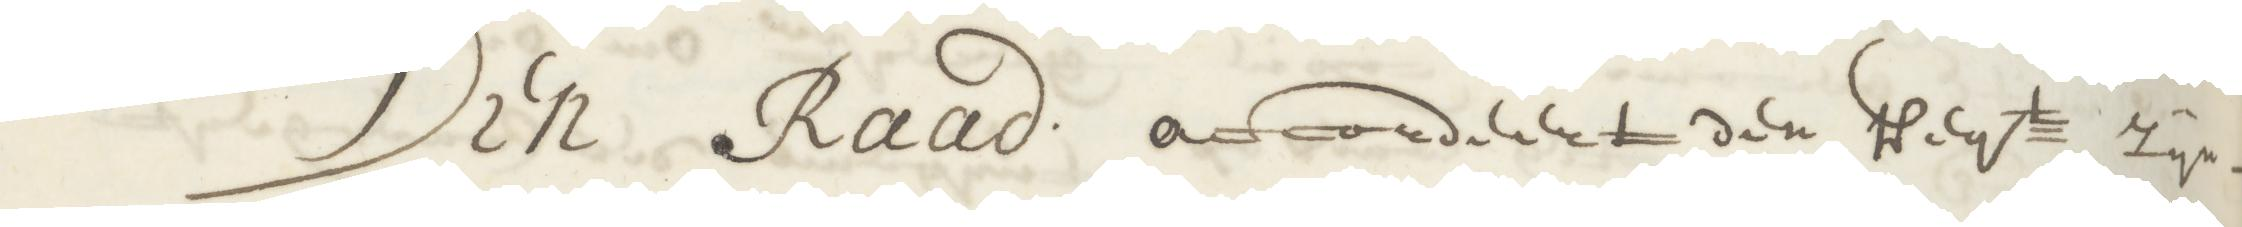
Den Raad accordeert der Req=t zijn
